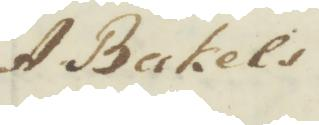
A. Bakels
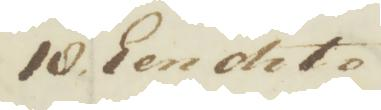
18. Een dito
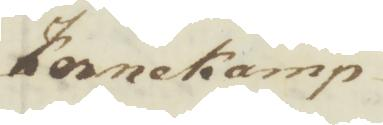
Zonnekamp
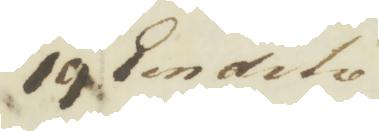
19 Een dito
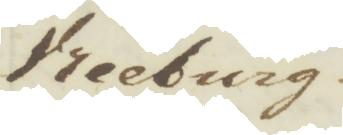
Vreeburg.
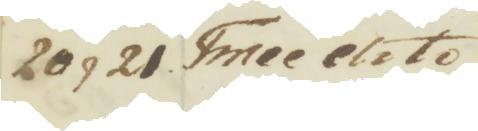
20 & 21. Twee dito
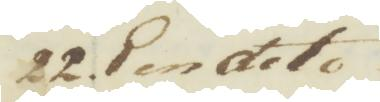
22. Een dito
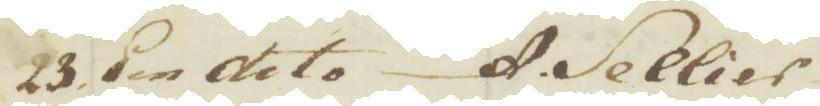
23. Een dito _ A. Sellier
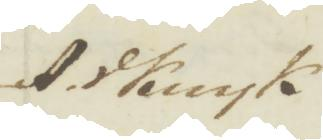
A. Vkuyk
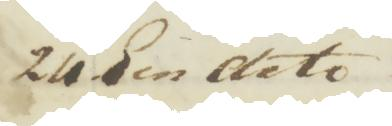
24. Een dito
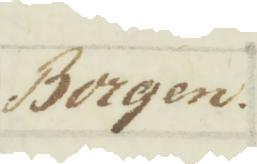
Borgen.
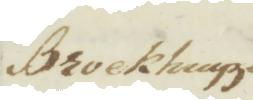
Broekhuyzen
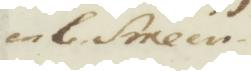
en C. Smeen
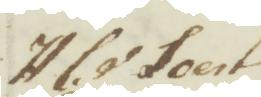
H C. v Loert
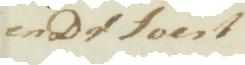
en D v Loert
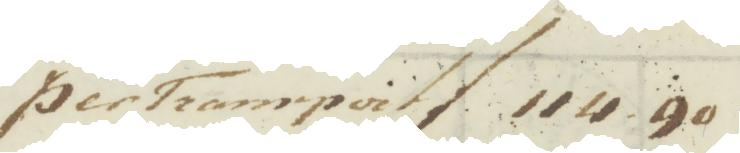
Per Transport ƒ 114.90
